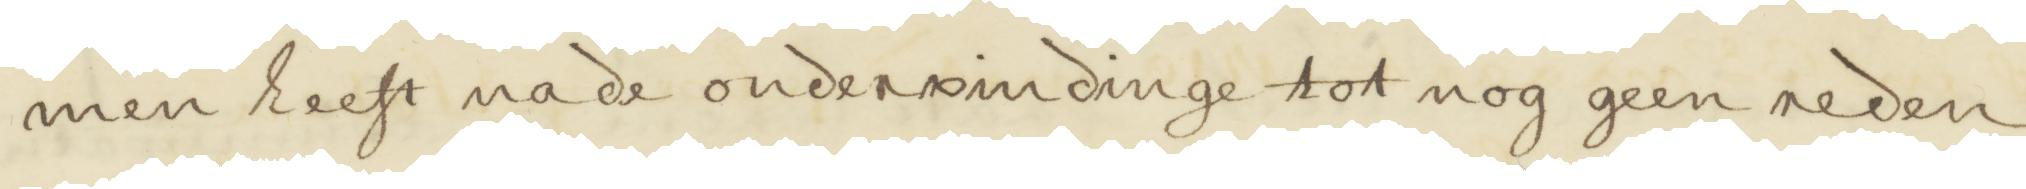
men heeft na de ondervindinge tot nog geen reden
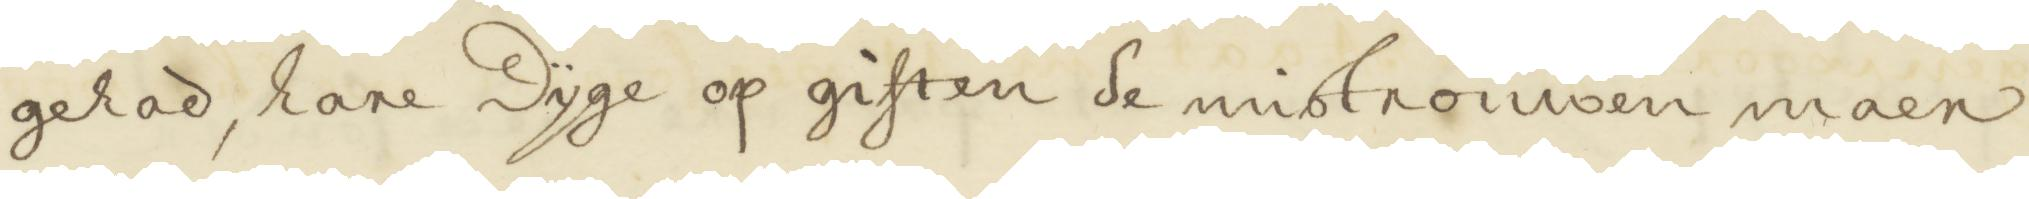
gehad, hare Eijge op giften te mistrouwen maer
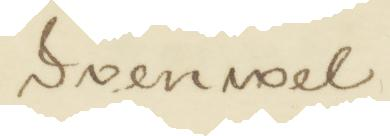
Evenwel
